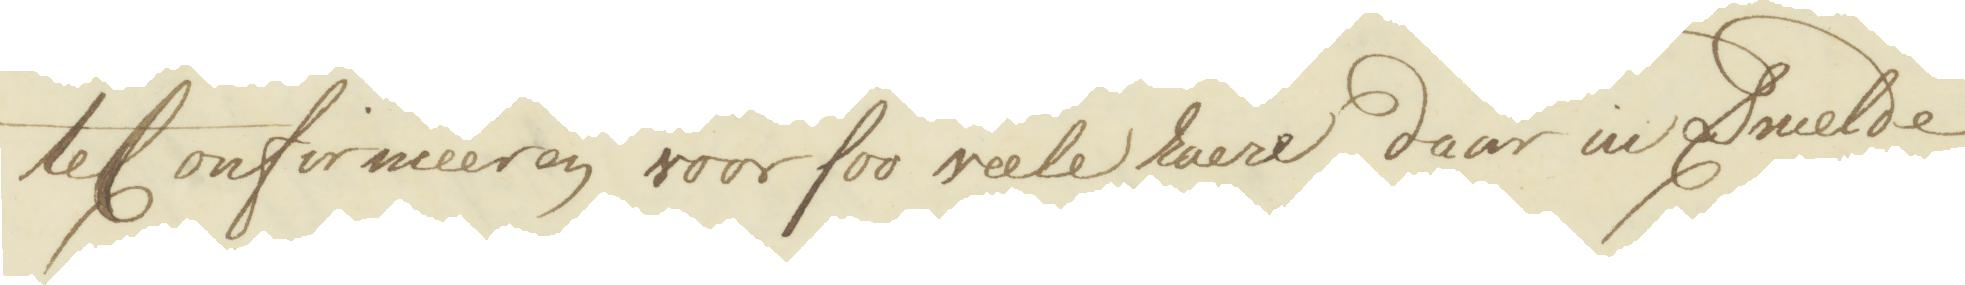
te confirmeeren voor soo veele haere daar in vermelde
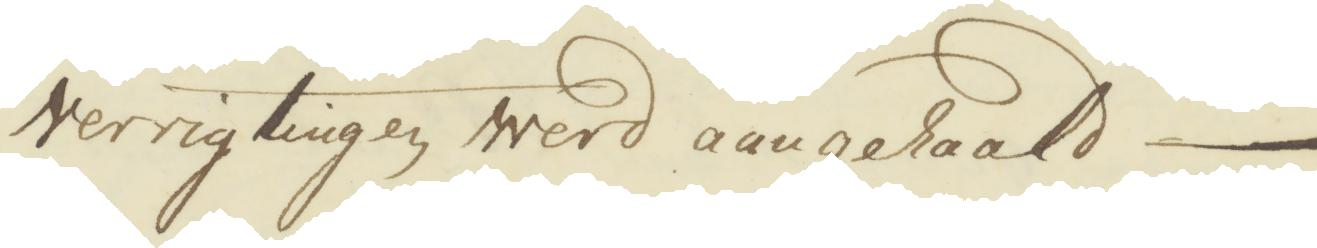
verrigtingen werd aangehaald —
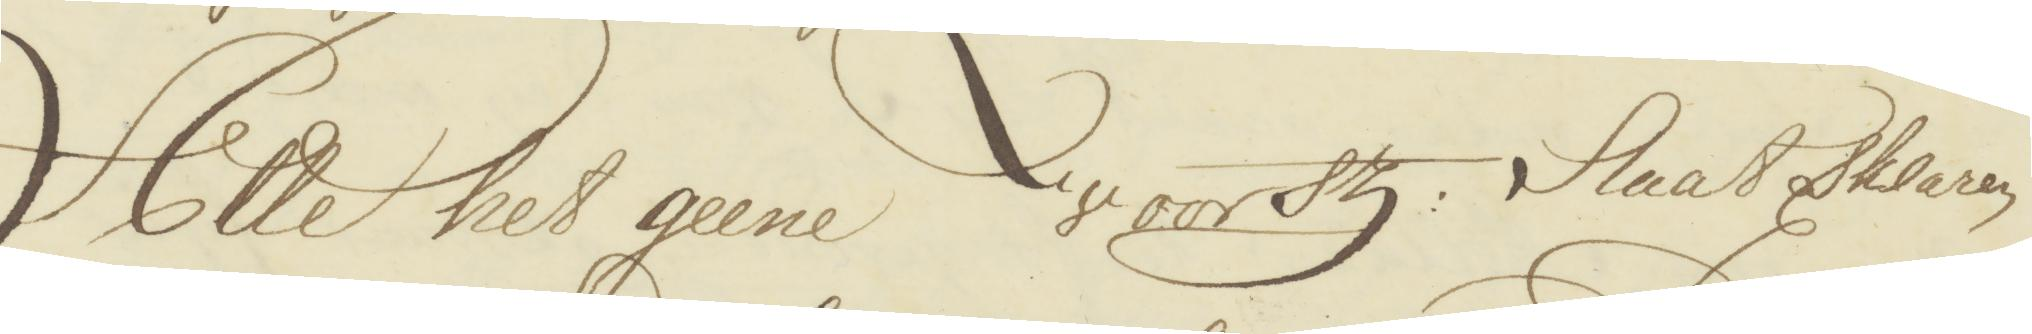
Alle het geene voorsz: Staat verklaren
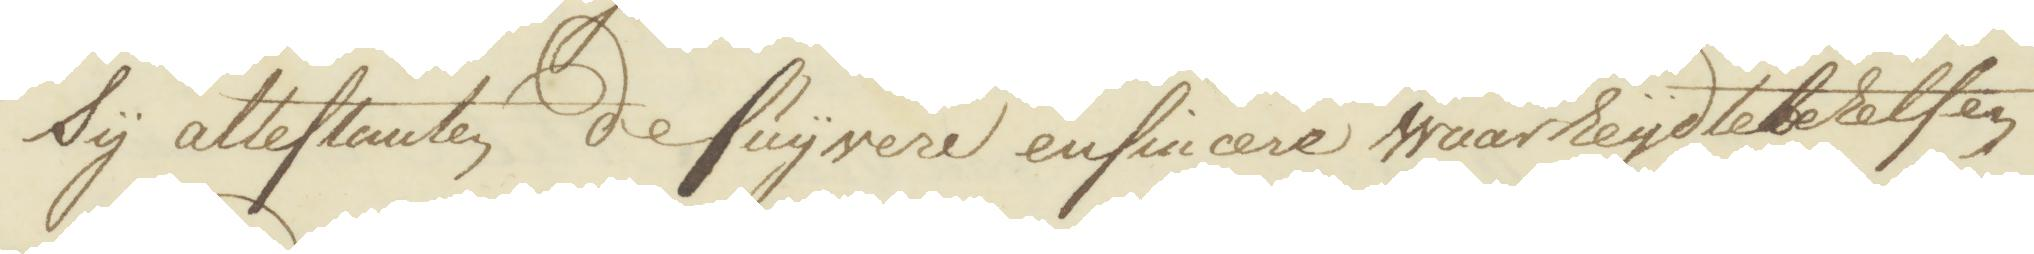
sij attestanten de suijvere en sincere waarheijd te behelsen
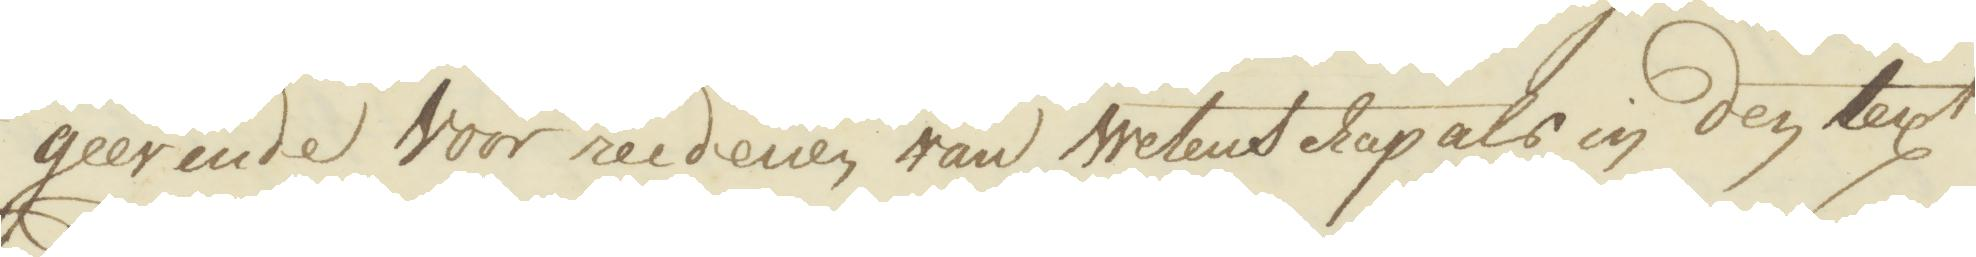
geevende voor reedenen van Wetenschap als in den text
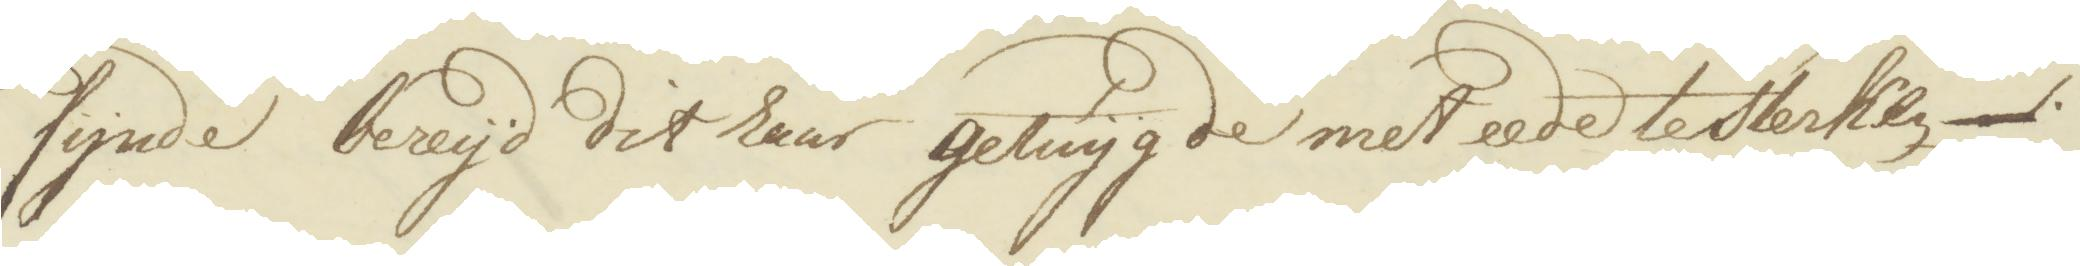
sijnde bereijd dit haar getuijgde met eede te sterken —.
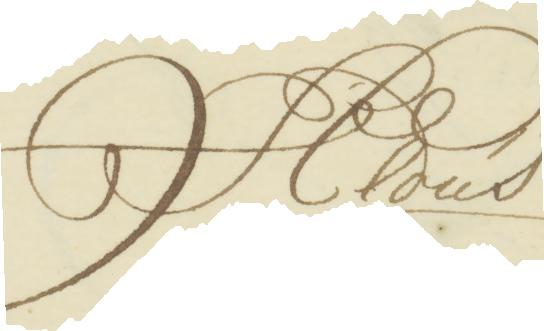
JClous
